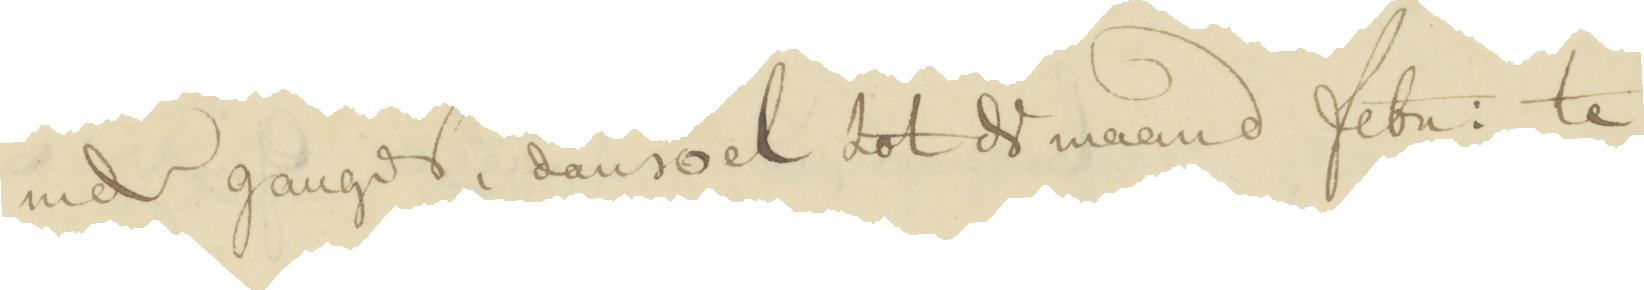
inde ganges, danwel tot de maand febr: te
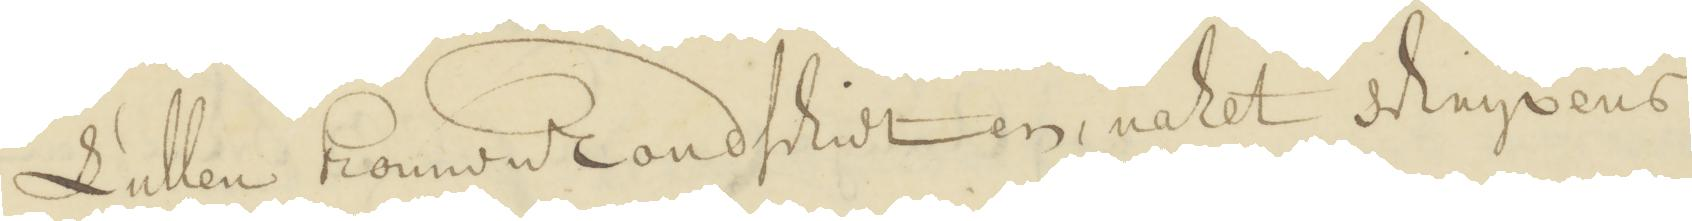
zullen konnen rondschieten, nahet schrijvens
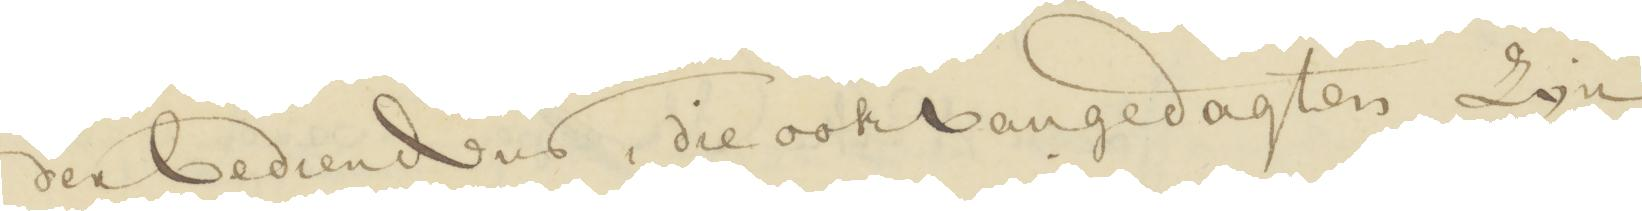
der bedienders, die ook van gedagten zijn
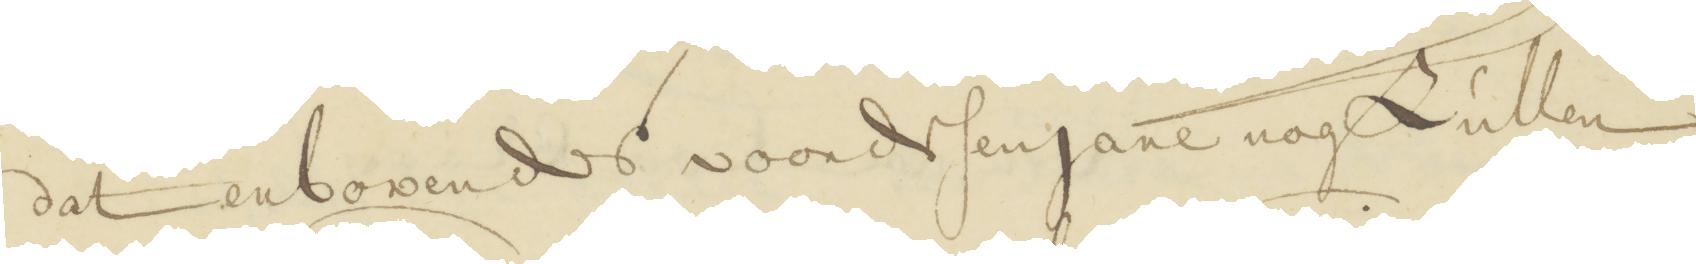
dat en boven des voor desen jare nog Zullen
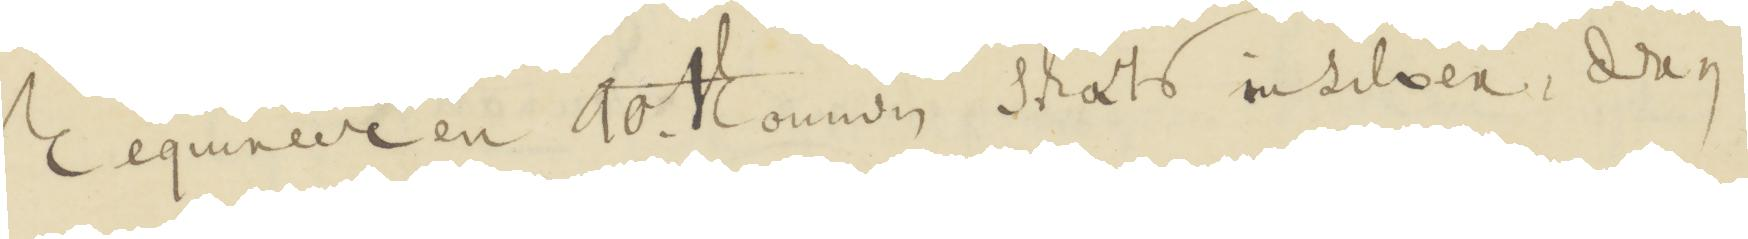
requireeren 40. Tonnen schats in zilver, der
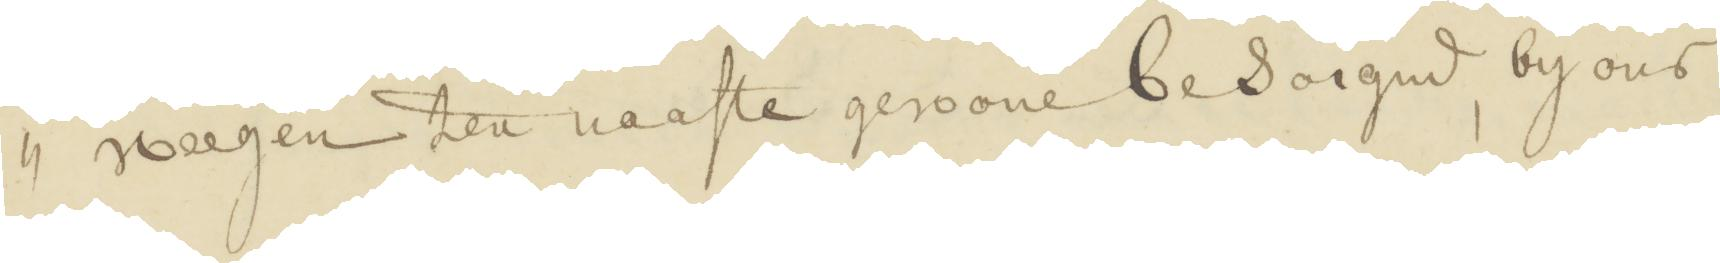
„weegen ter naaste gewone besoigne, bij ons
